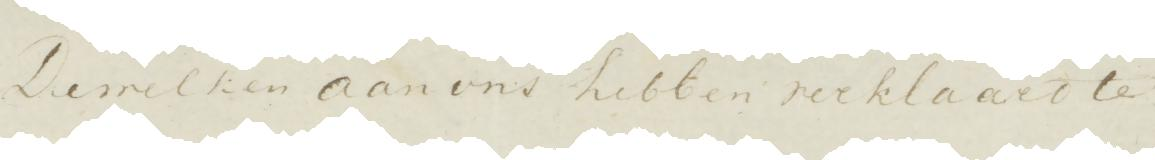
Dewelken aan ons hebben verklaard te
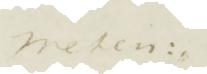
weten:,
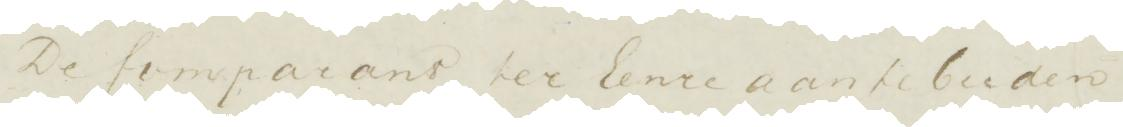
De Comparant ter Eenre aan te bieden
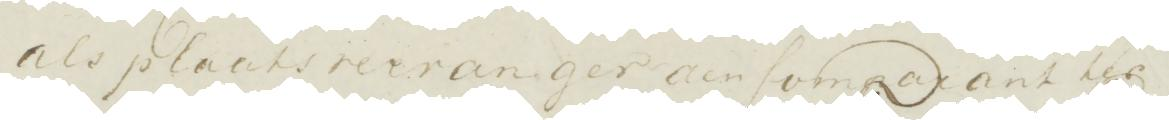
als plaats vervanger der Comparant ter
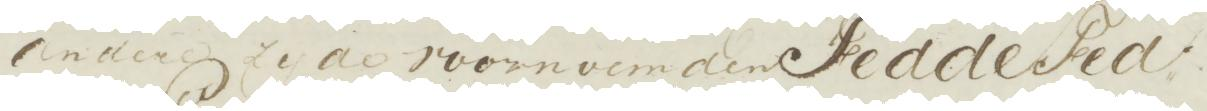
anderen zyde voornoemden Fedde Fed„
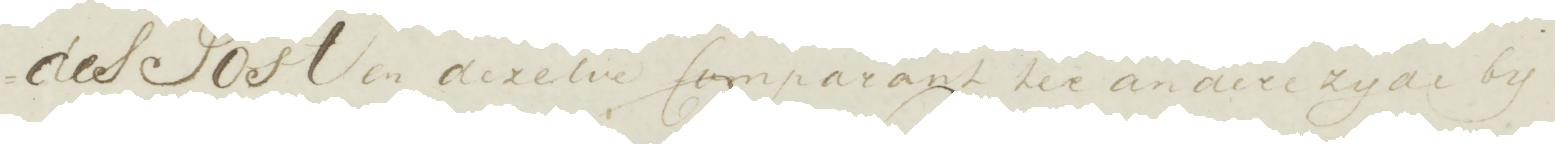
=des Post en dezelve Comparant ter andere zyde by
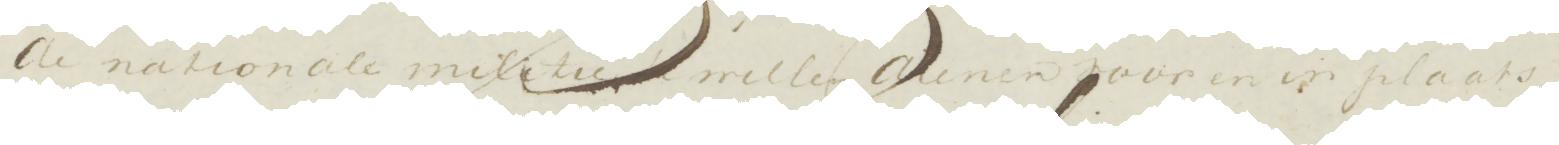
de nationale militie te willen dienen voor en in plaats
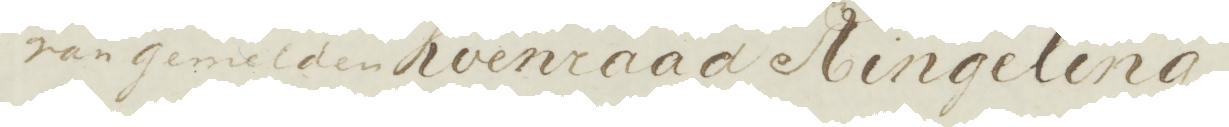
van gemelden Koenraad Ringeling.
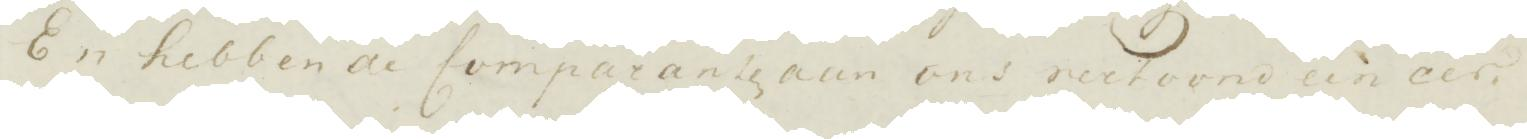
En hebben de Comparanten aan ons vertoond een cer,
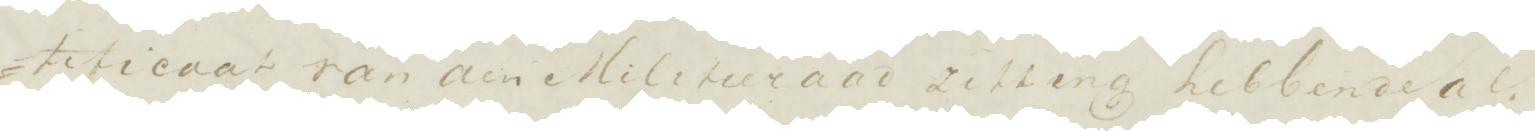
=tificaat van den Militieraad zitting hebbende al,
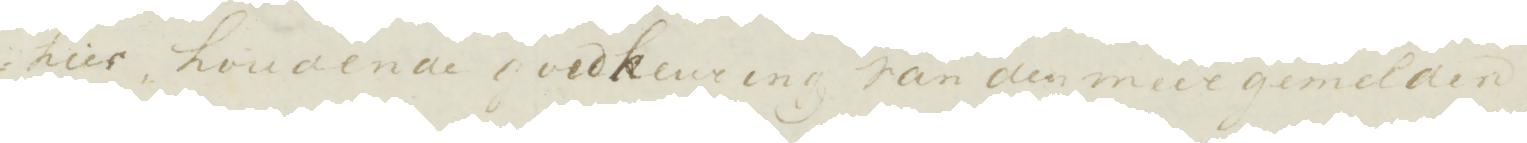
=hier, houdende goedkeuring van den meer gemelden
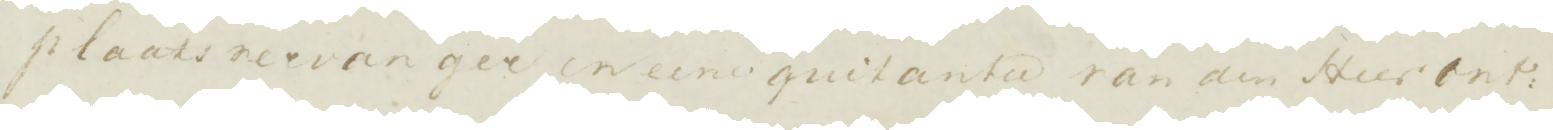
plaats vervanger en eene quitantie van den Heer ont:
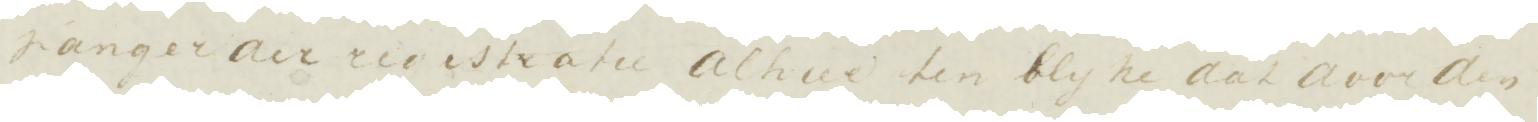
=vanger der registratie alhier ten blyke dat door den
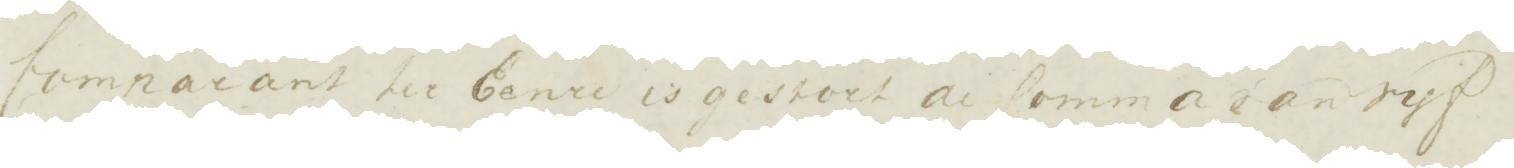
Comparant ter Eenre is gestort de somma van vyf
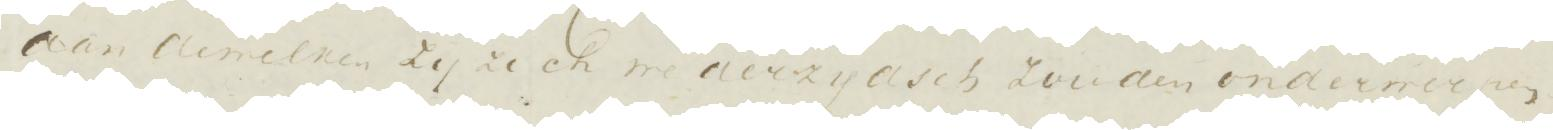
aan dewelken zy zich wederzydsch zouden onderwerpen
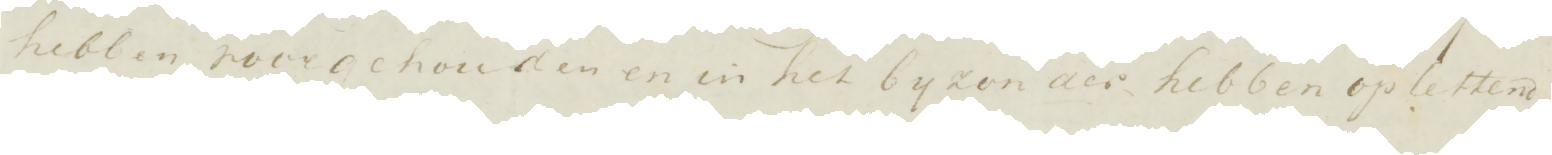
hebben voorgehouden en in het byzonder hebben oplettend
